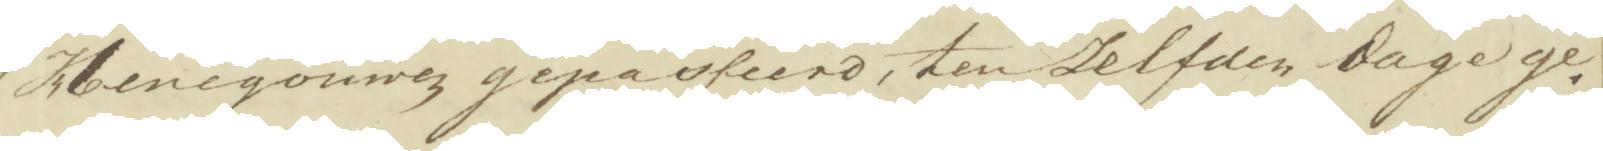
Henegouwen gepasseerd, ten zelfden dage ge„
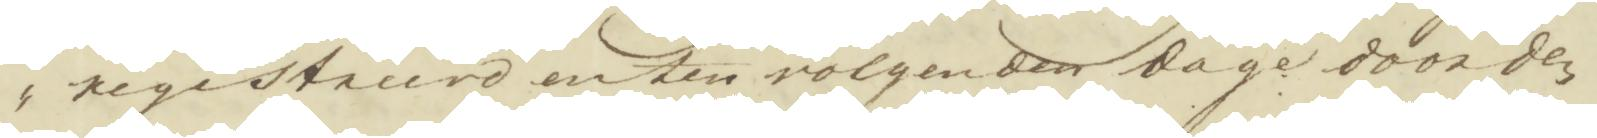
„registreerd en ten volgenden dage door den
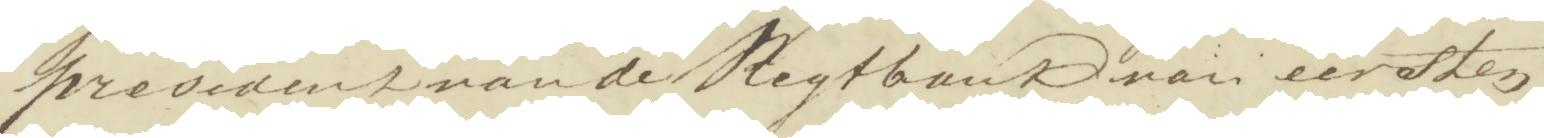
president van de Regtbank van eersten
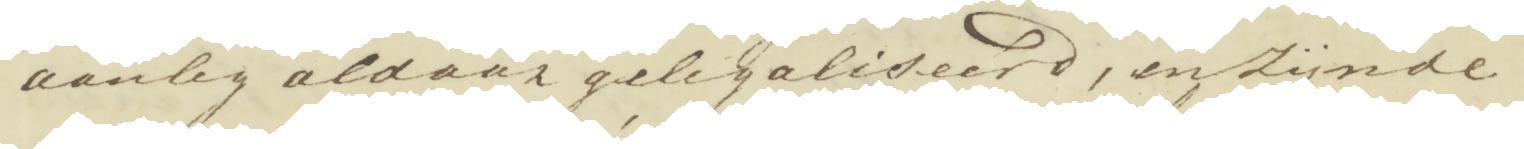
aanleg aldaar gelegaliseerd, en zijnde
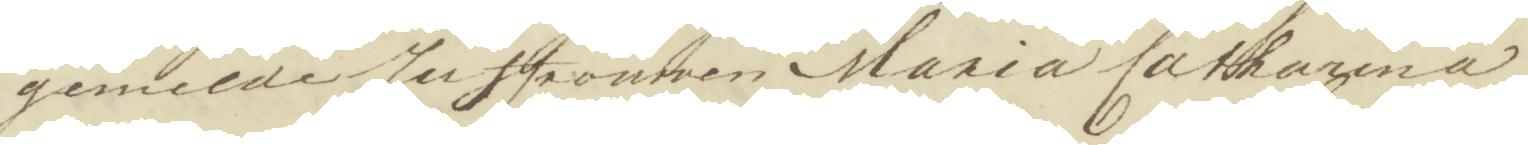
gemelde Juffrouwen Maria Catharina
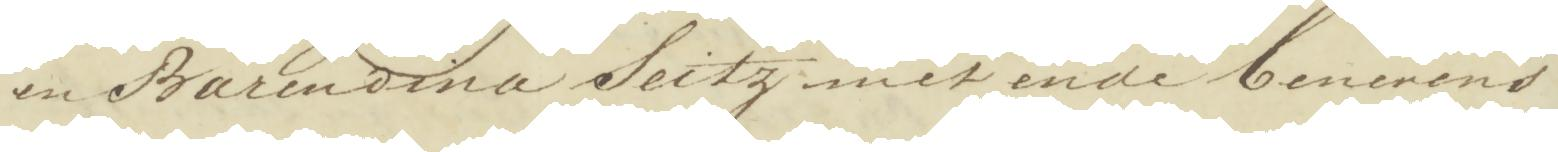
en Barendina Seitz met ende benevens
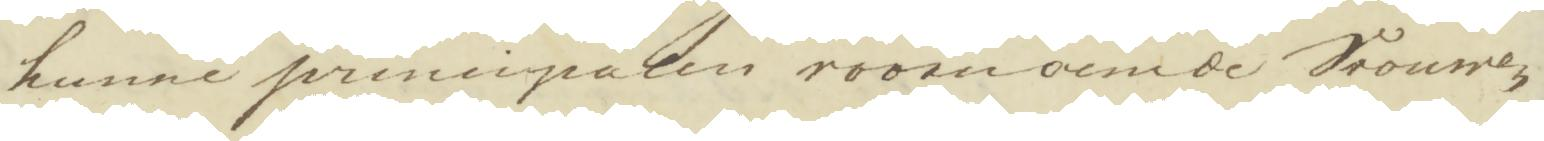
hunne principalen voornoemde Vrouwen
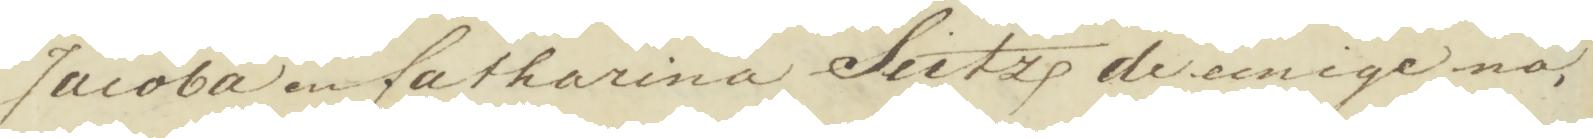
Jacoba en Catharina Seitz de eenige na,
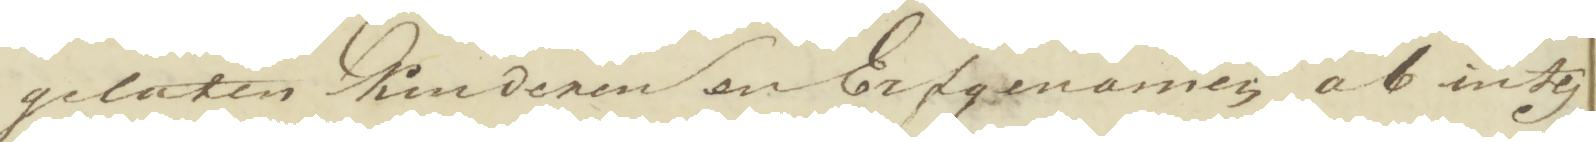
gelaten Kinderen en Erfgenamen ab intes,
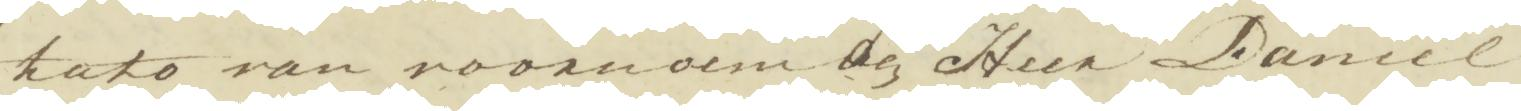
tato van voornoemden Heer Daniel
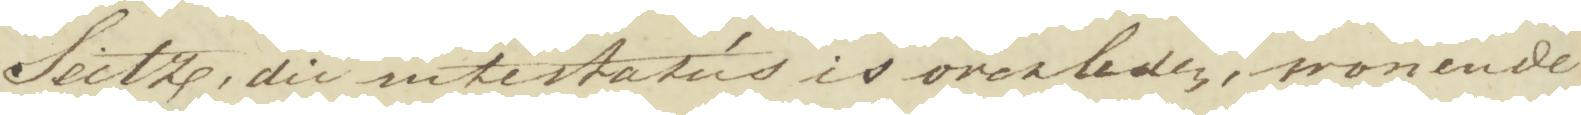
Seitz, die in testatus is overleden, wonende
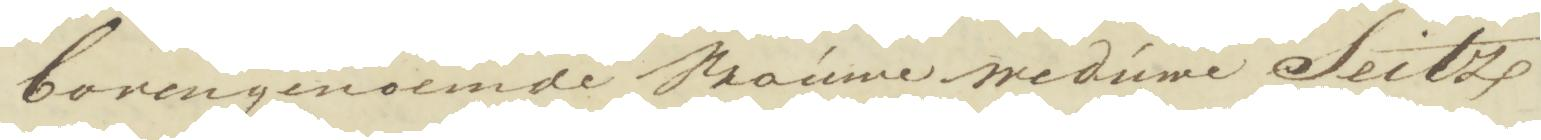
bovengenoemde Vrouwe weduwe Seitz
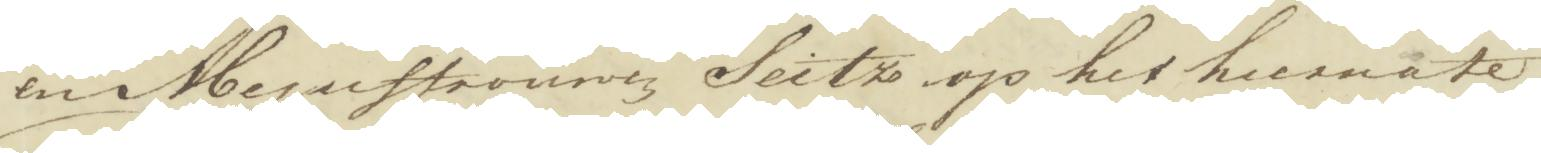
en Mejuffrouwen Seitz op het hierna te
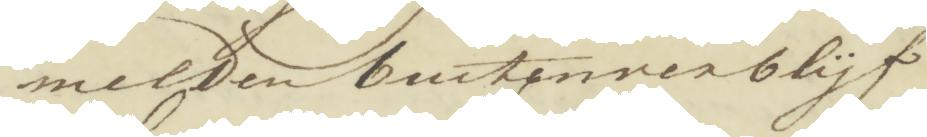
melden buitenverblijf
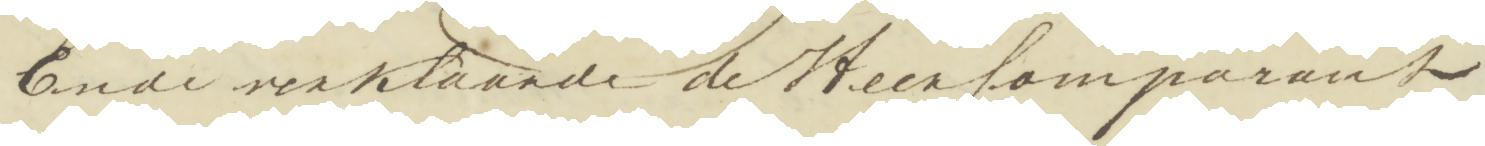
Ende verklaarde de Heer Comparant
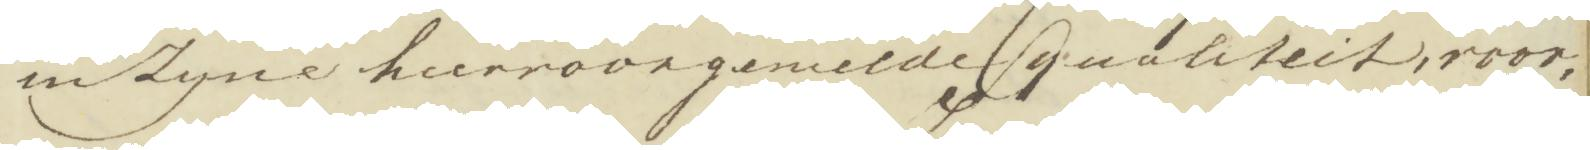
in zyne hiervoorgemelde qualiteit, voor,
